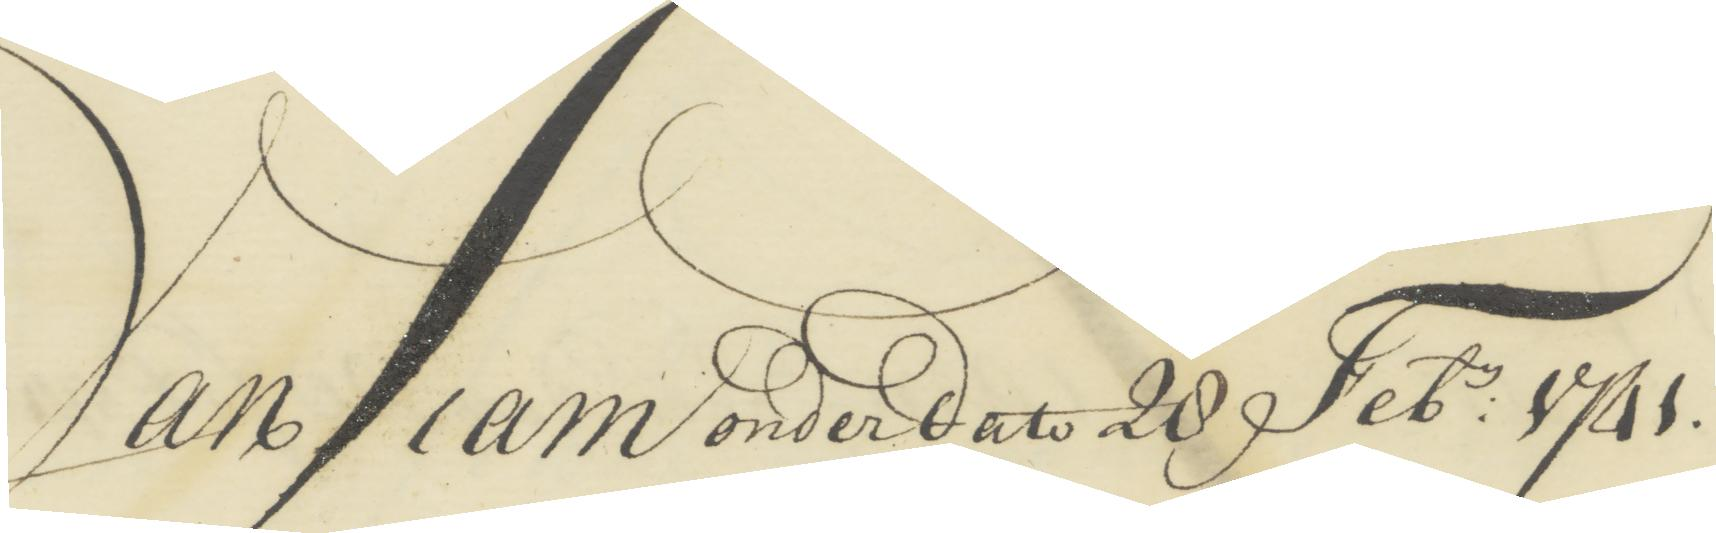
Van Siam onderdato 28 Feb:y 1741.
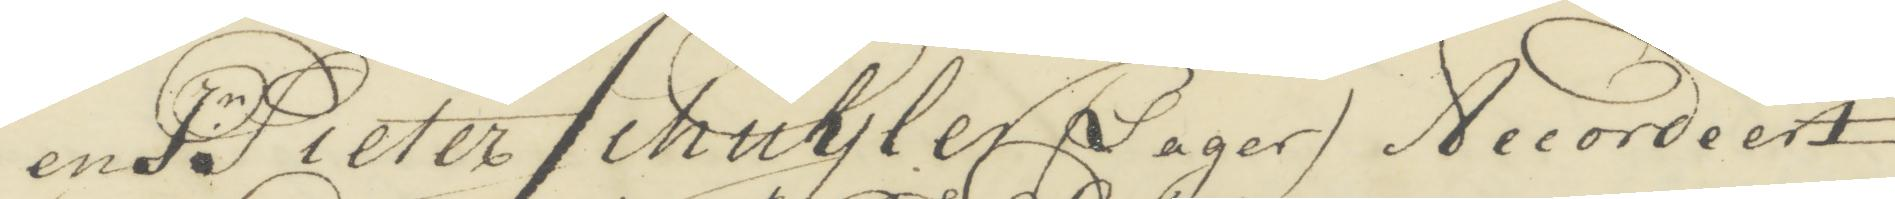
en J.r Pieter Schuylen (Lager) Accordeert
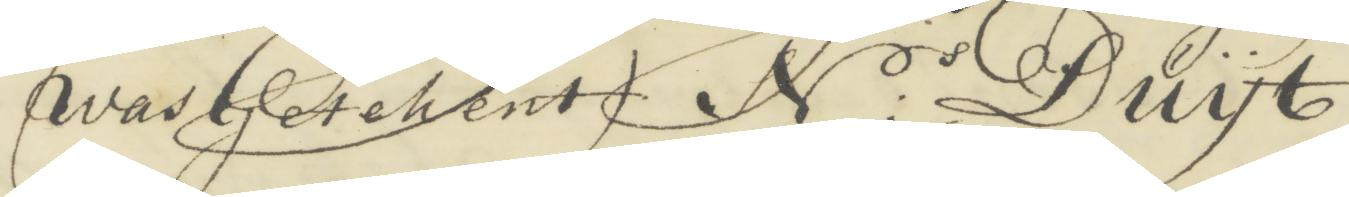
(was Getekent) N:s Duijt
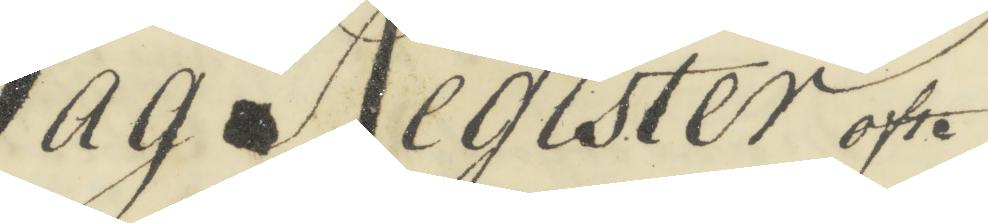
Dag Register ofte
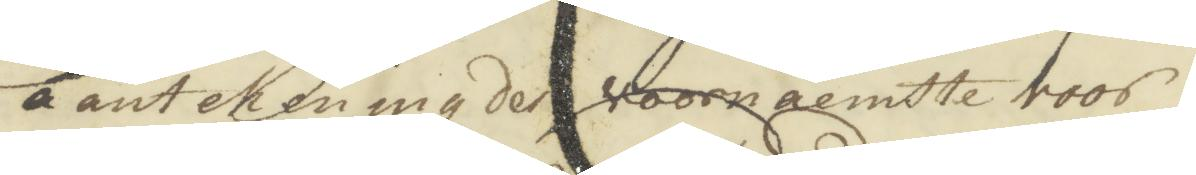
aantekening der voornaamste voor
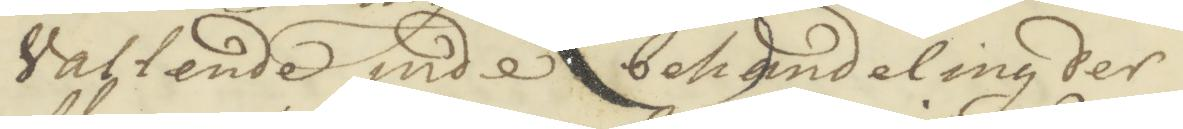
vallende inde behandeling der
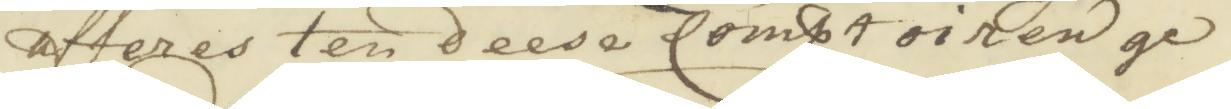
afferes ten deese Comptoiren ge
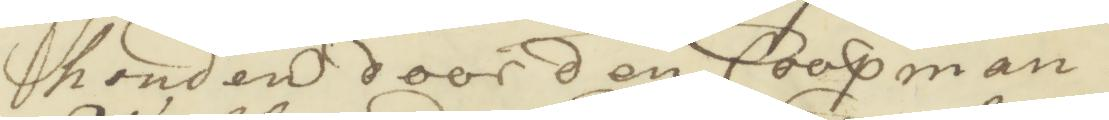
houden door den Coopman
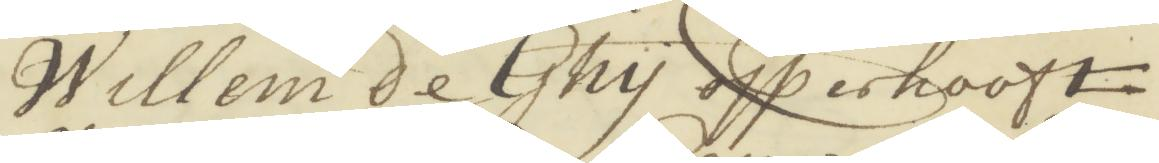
Willem de Ghij opperhooft
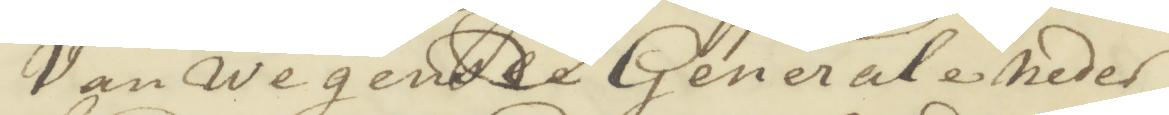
van wegens de Generale neder
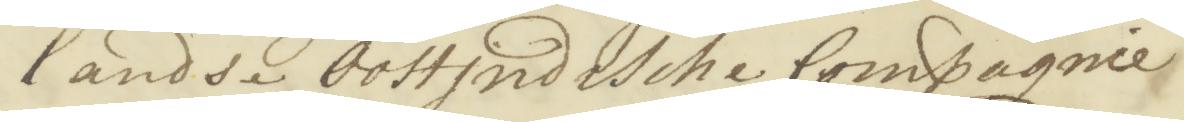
landse Oostjndische Compagnie
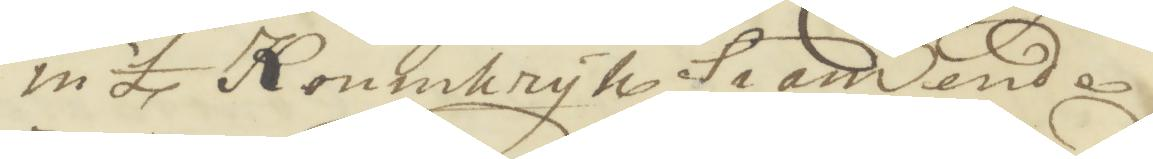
in ’t Koninkrijk Siam ende
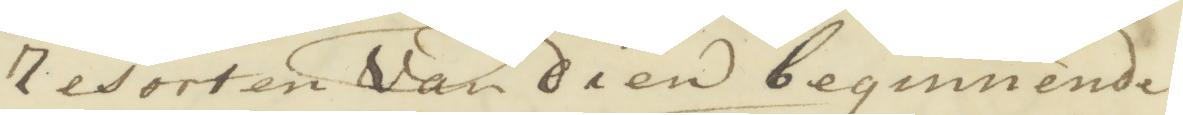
resorten van dien beginnende
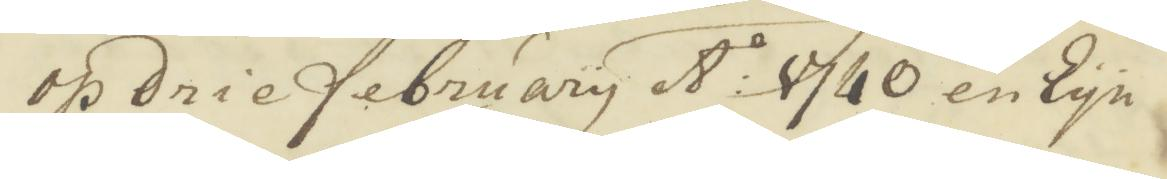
op drie februarij A:o 1740 en Eijn
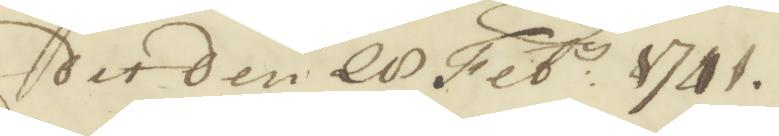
dit den 28 Feb:y 1741.
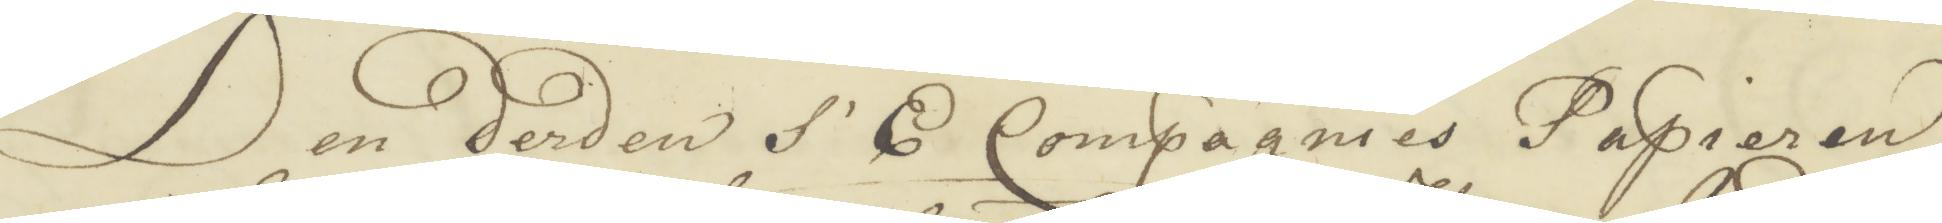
Den derden s'E Compagnies Papieren
